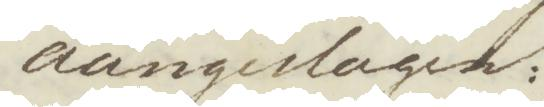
aangeslagen:
